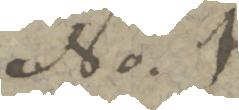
No. 1
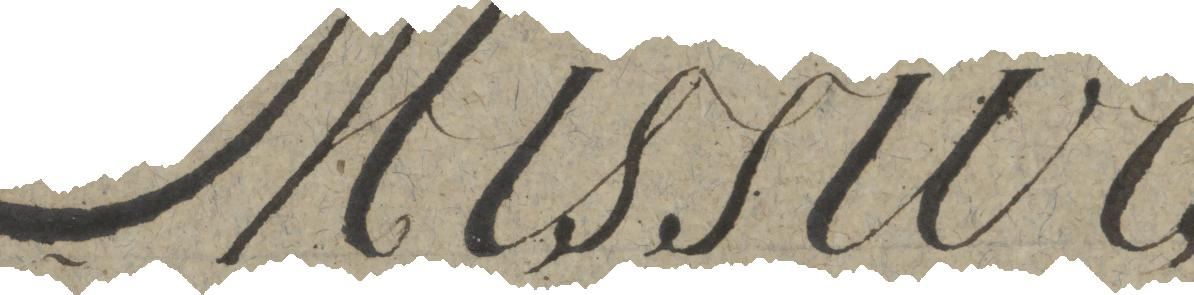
Missives
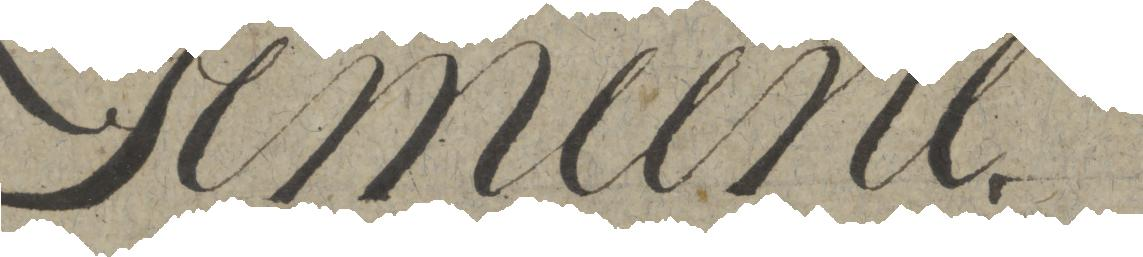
Gemeene
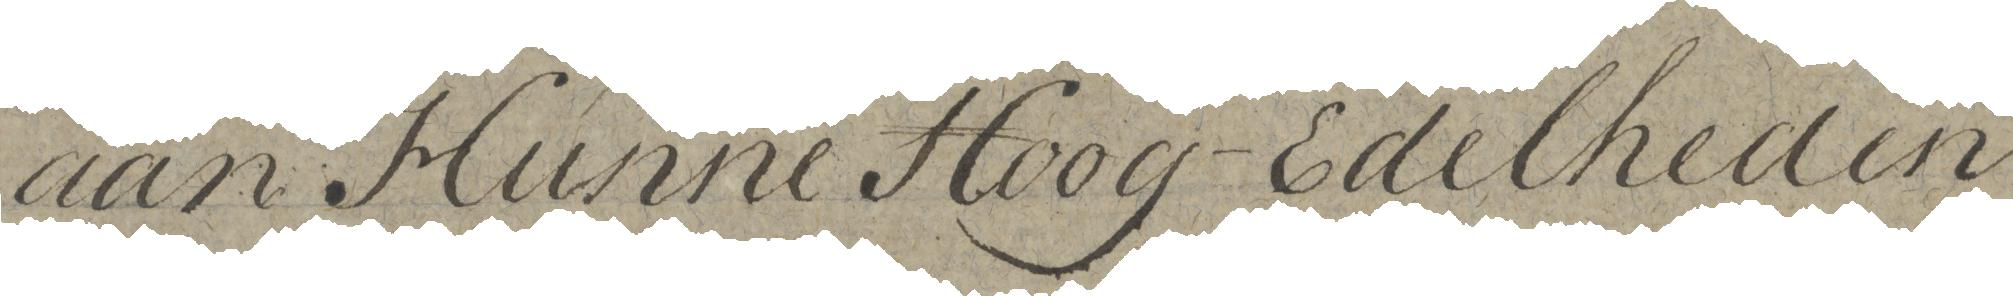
aan Hunne Hoog-Edelheden
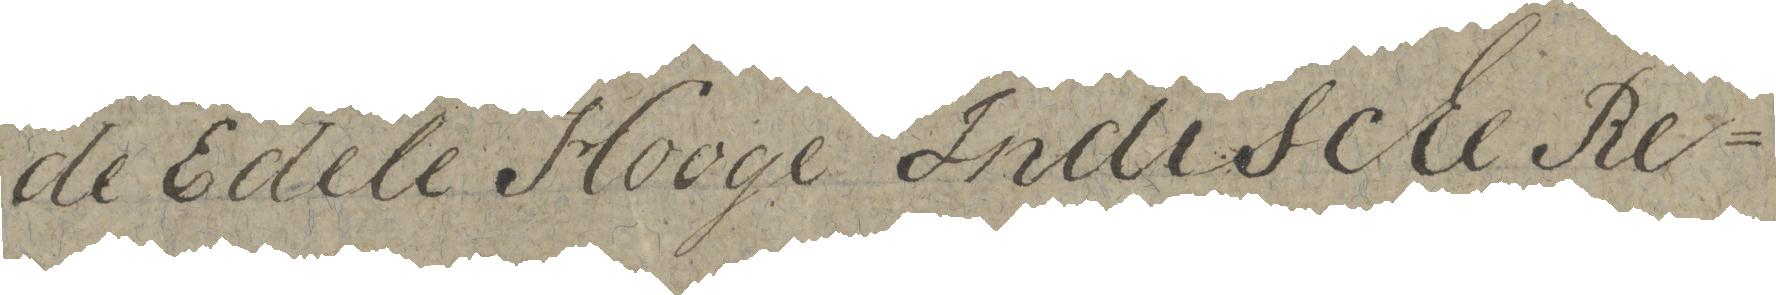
de Edele Hooge Indische Re=
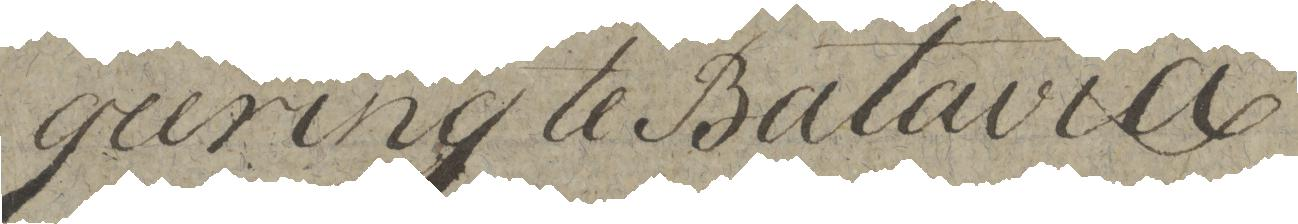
=geering te Batavia
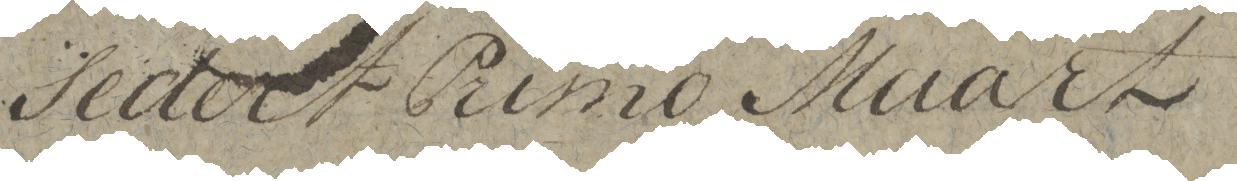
Sedert Primo Maart
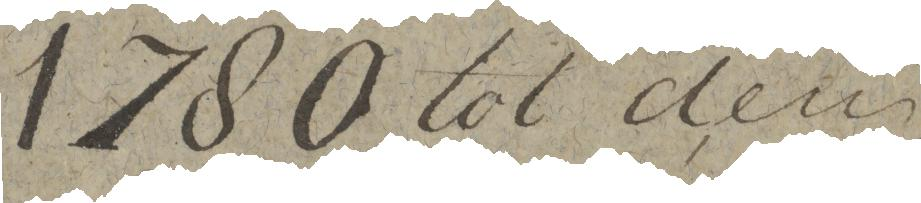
1780 tot den
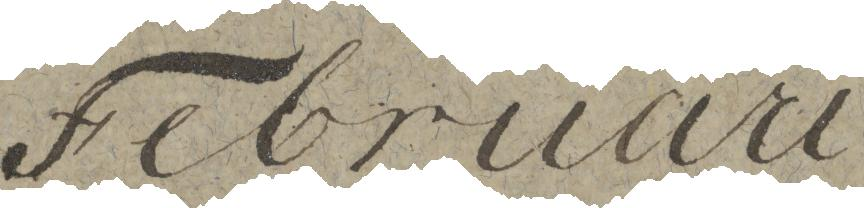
Februari
